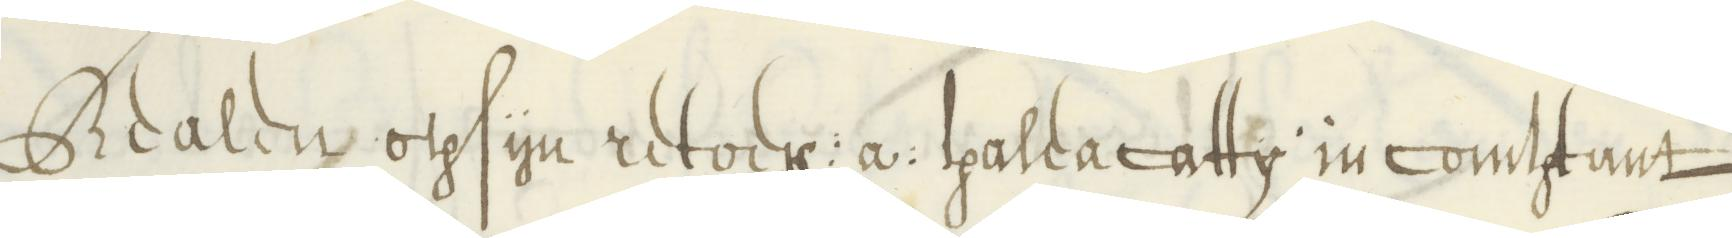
Realen op sijn retoer: a: pallacattij in comptant
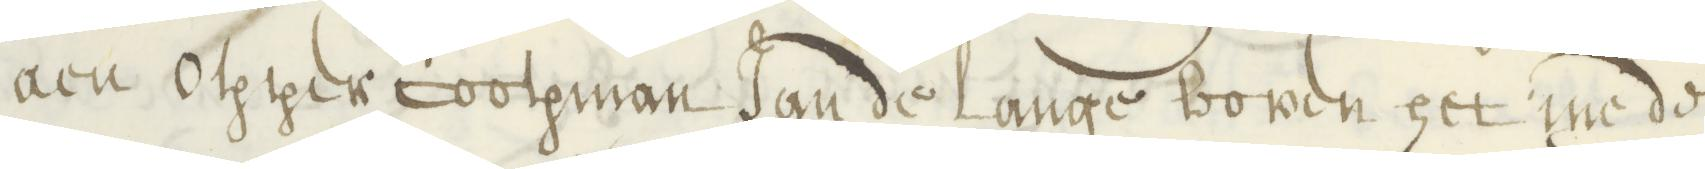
aen opppercoopman Ian de Lange boven het mede
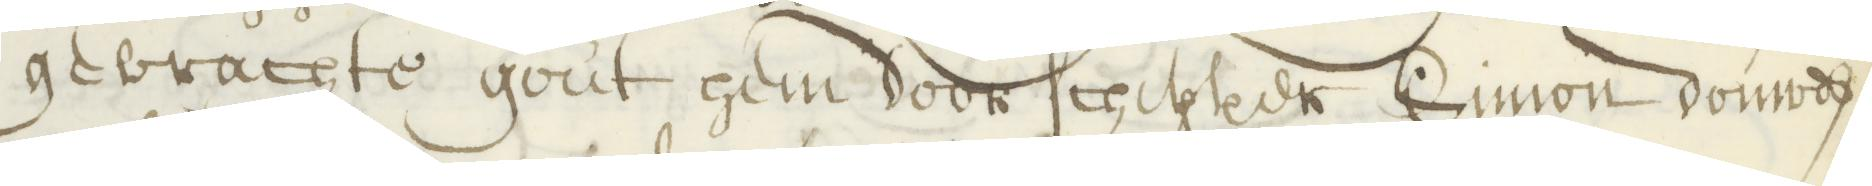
gebrachte gout gem door schipper Simon douwes
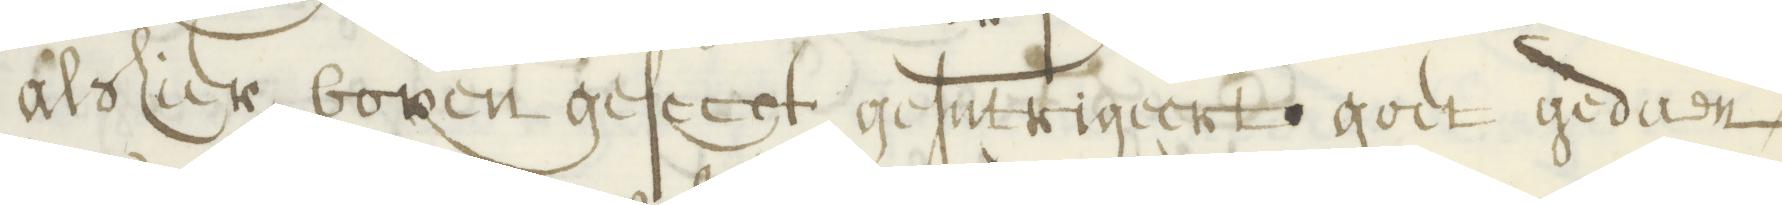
als hier boven gesecht gesutrigeert goet gedaen
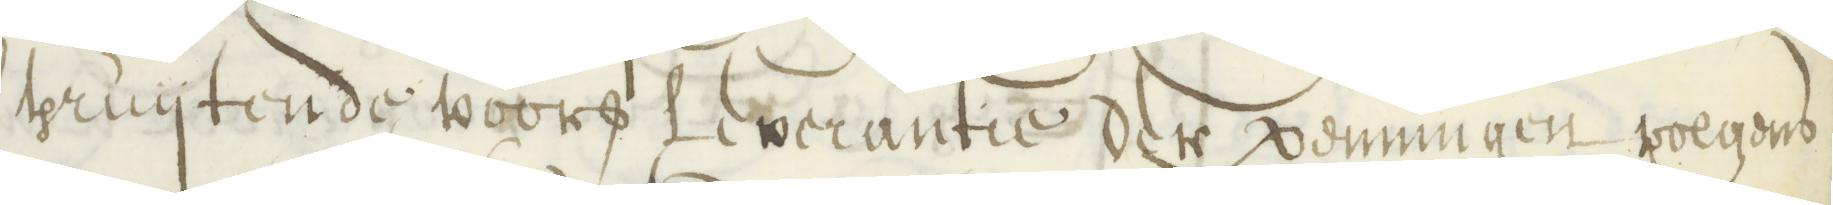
spruijtende voors Leverantie der penningen volgens
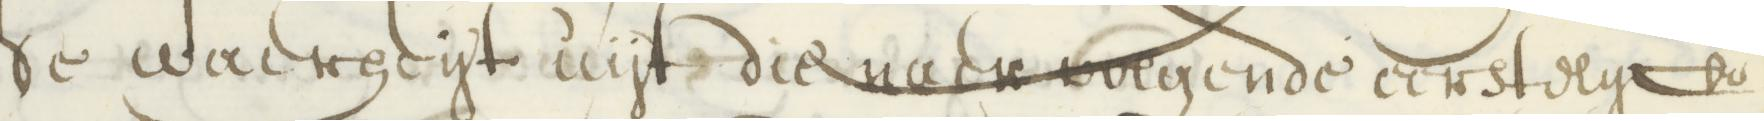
de waerheijt uijt die naer volgende eerstelyck
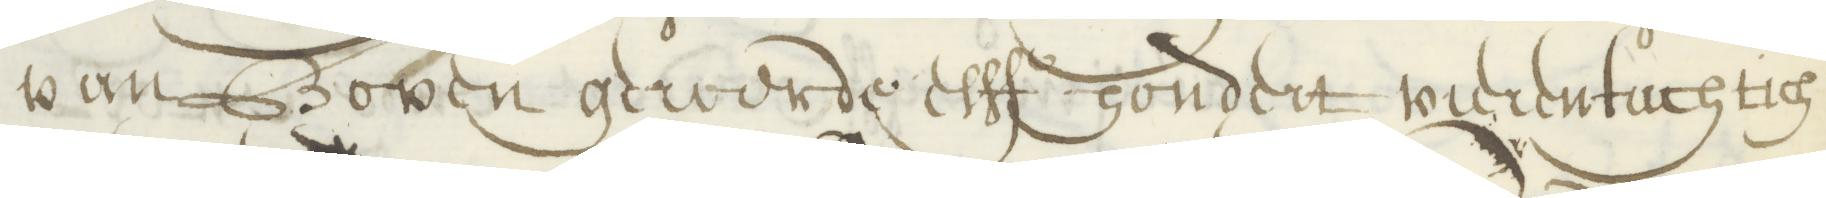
van Boven geroerde elff hondert vierentachtich
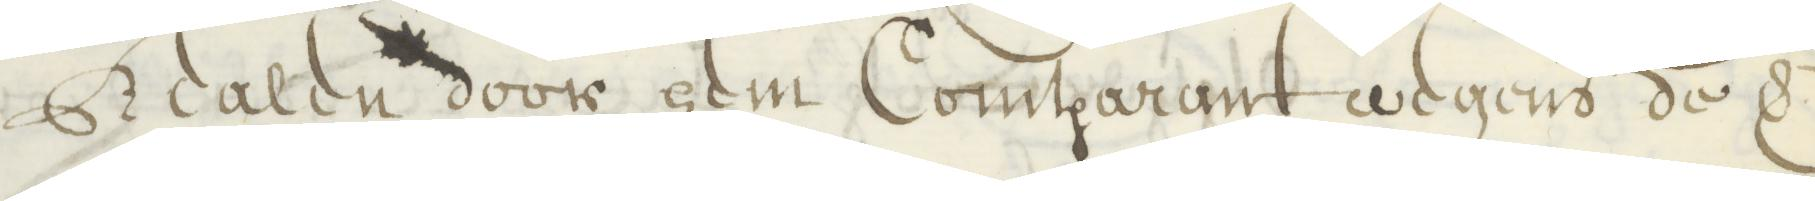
Realen door hem Comparant wegens de ver
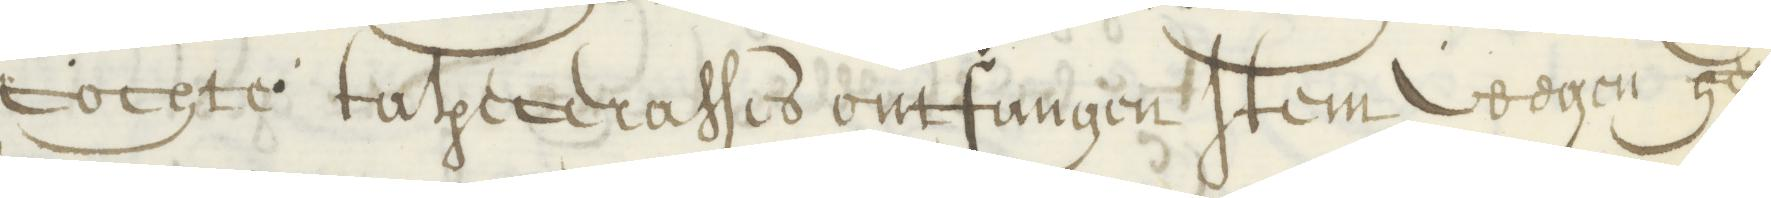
cochte tapecerasses ontfangen jtem wegen het
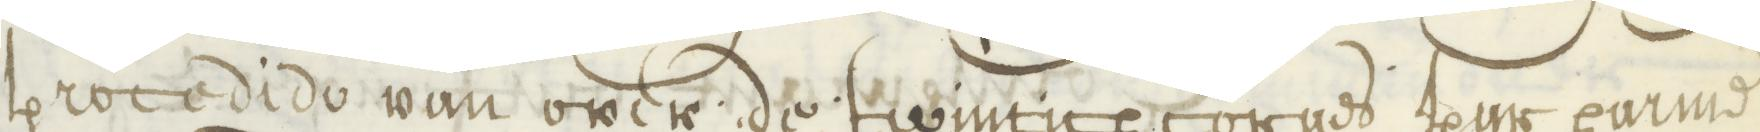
procedido van over de twintich corges par harme
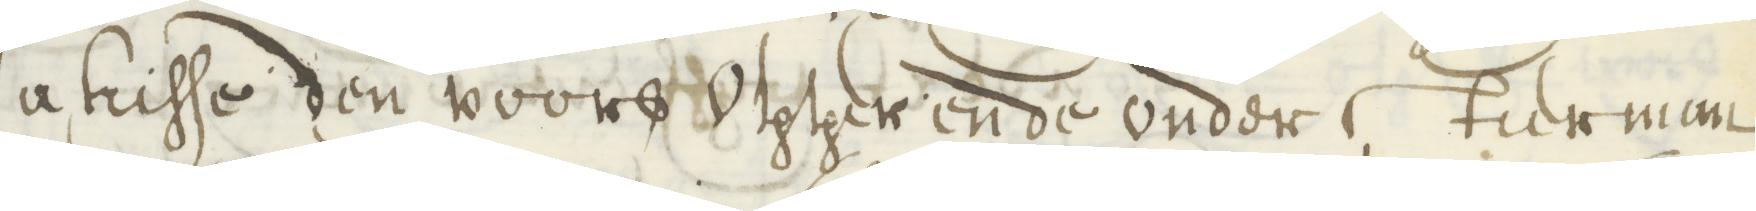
sakisse den voors opper en de onder stierman
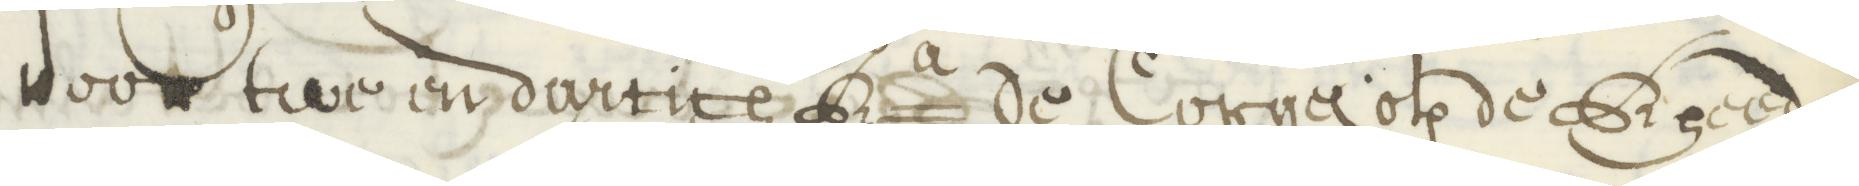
voor twe en dartich R=a de Corge op de Rheede
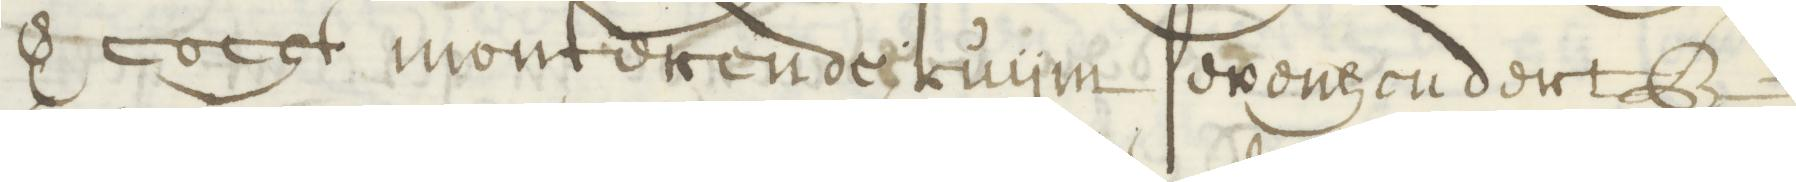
vercocht monterende ruijm sevenhondert R=a
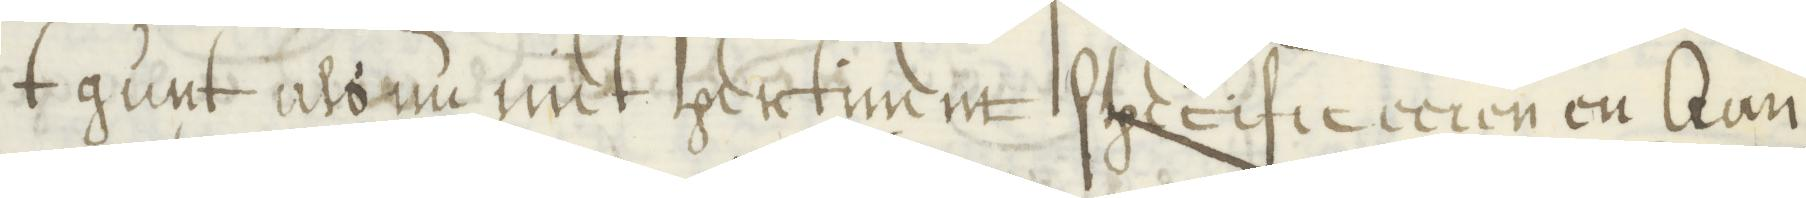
t gunt als nu niet pertinent specificeeren en kan
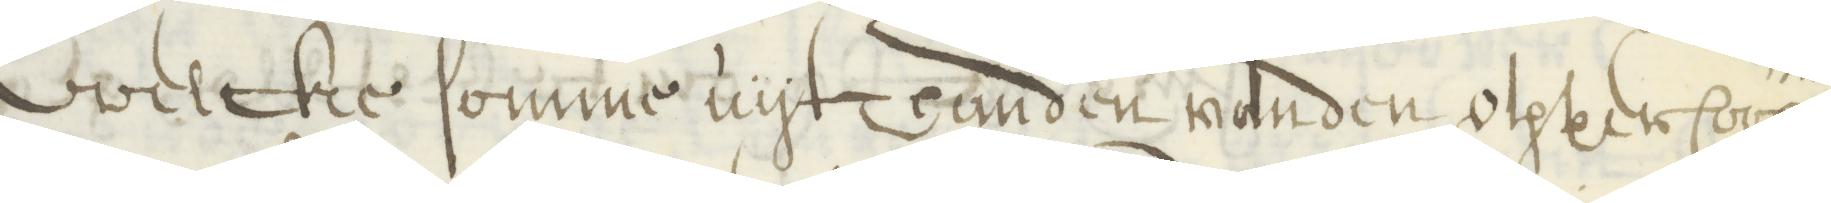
welcke somme uijt handen van den oppercoop=m
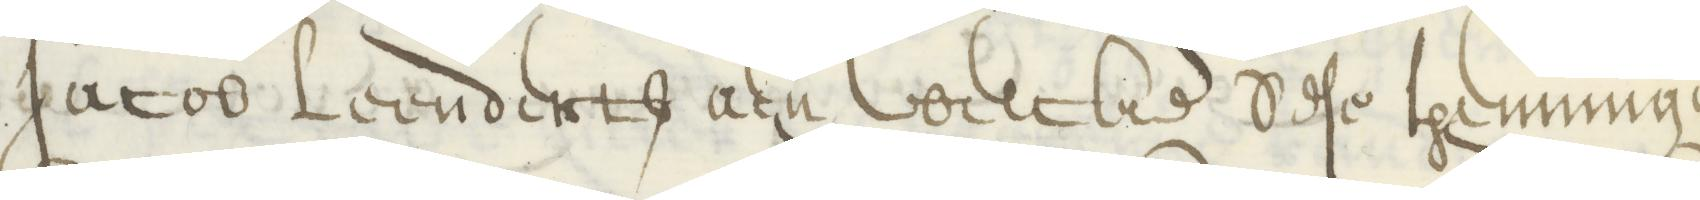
Jacob Leenderts aen welcke dese penningen
